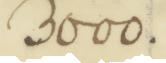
3000.
